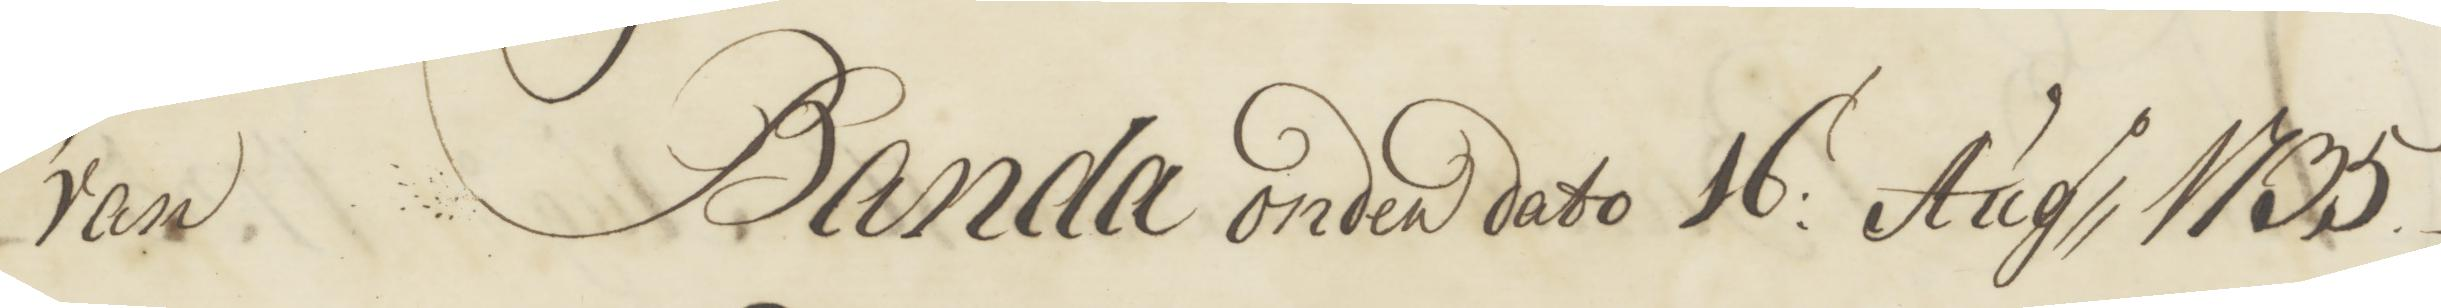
van Banda onder dato 16:' Aug„s 1735.
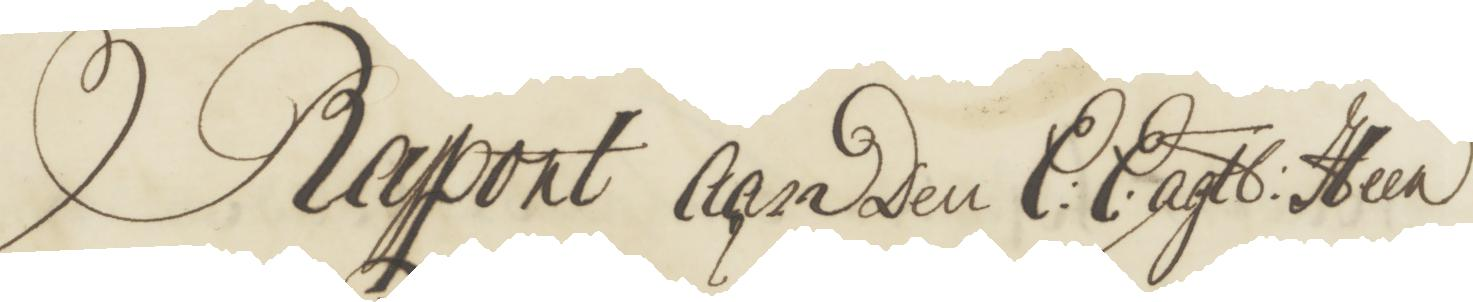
Rapport aan den E: E: agtb: Heer
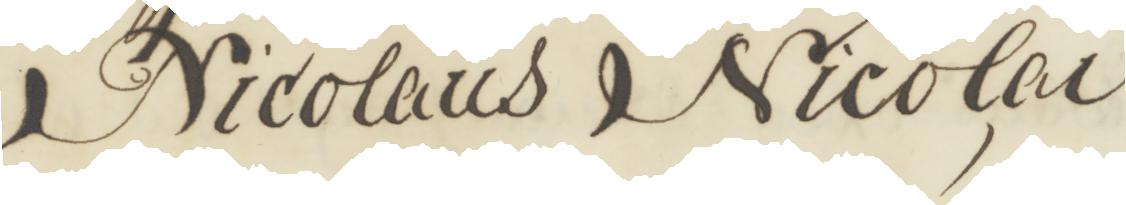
Nicolaus Nicolai
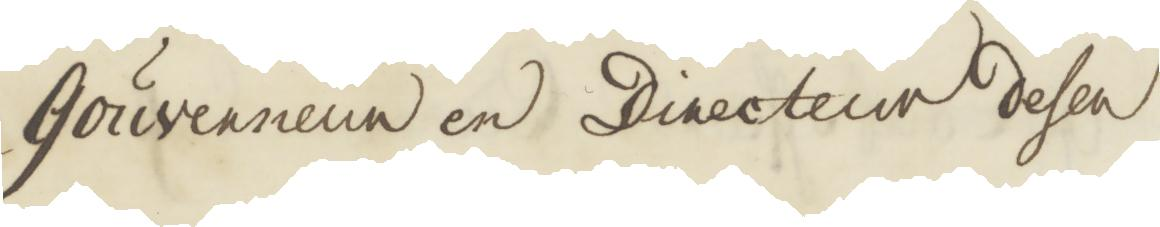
Gouverneur en Directeur deser
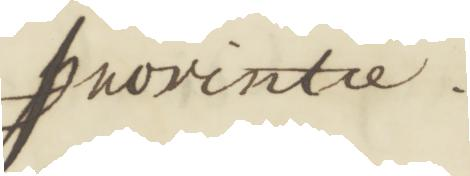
provintie.
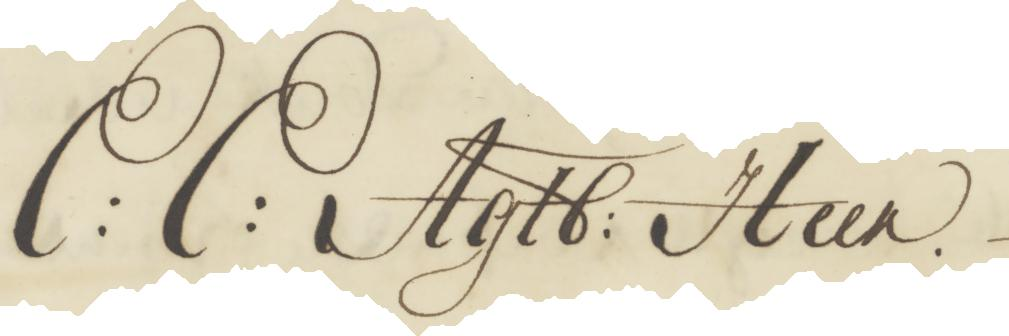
E: E: Agtb: Heer.
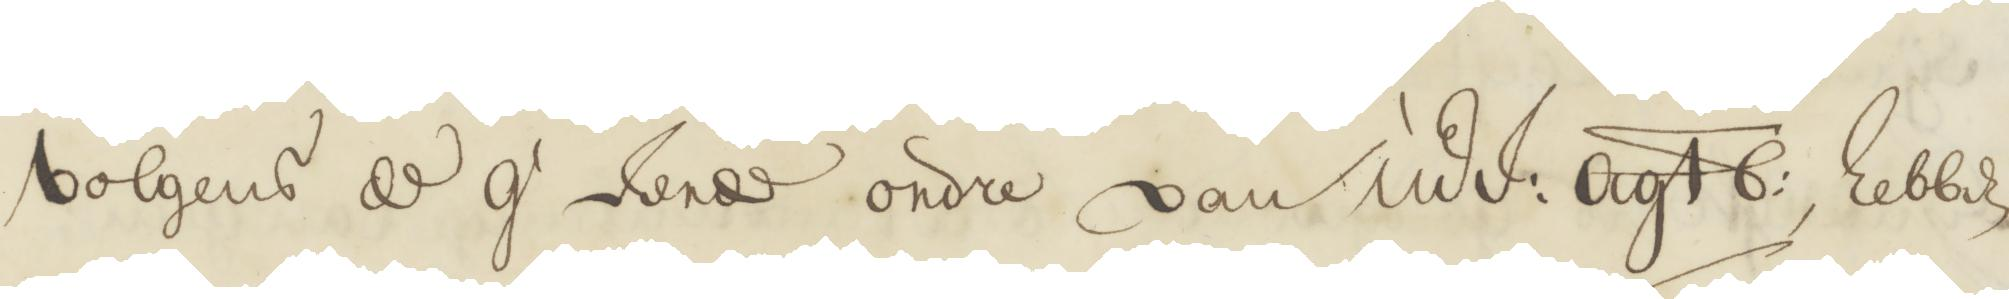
volgens de g’Eerde ordre van u E E: agtb:, hebben
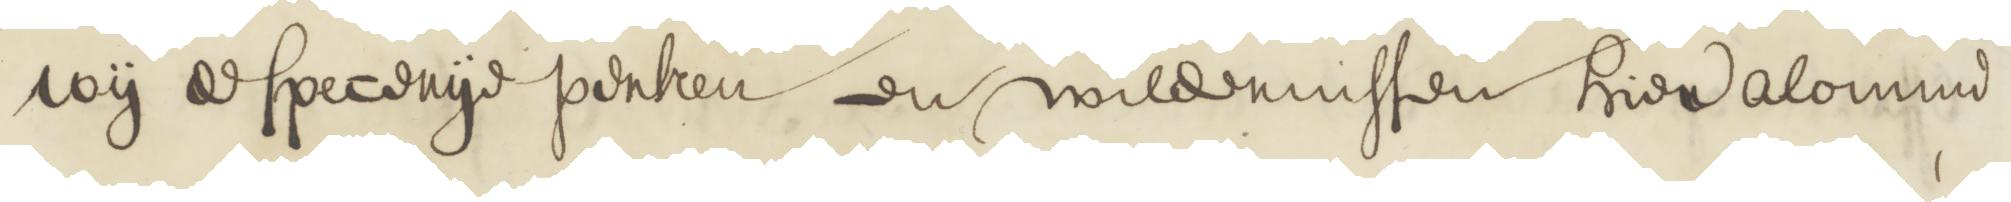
wij de specerije perken en wildernissen hier alomme
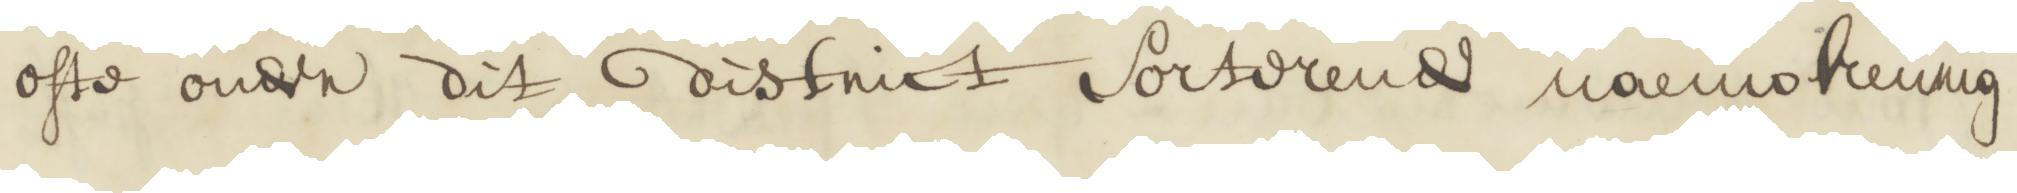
ofte onder dit district Sorterende naeuwkeurig
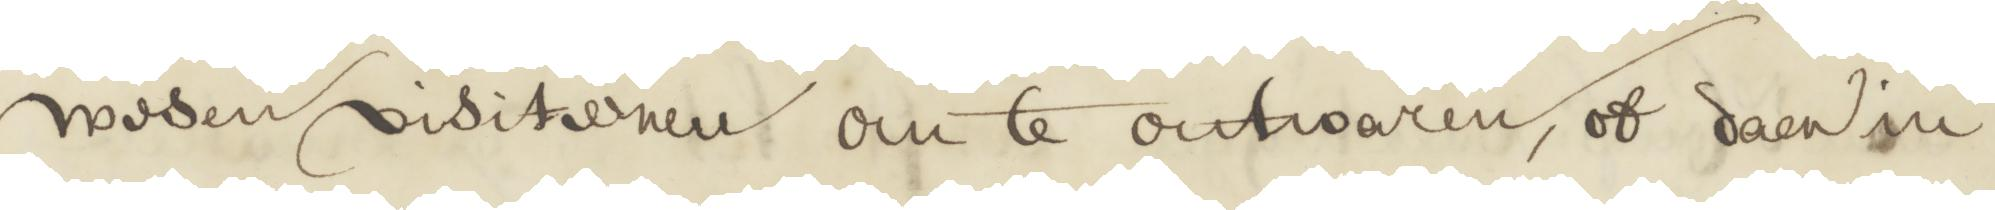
wesen visiteeren om te ontwaren, of daer in
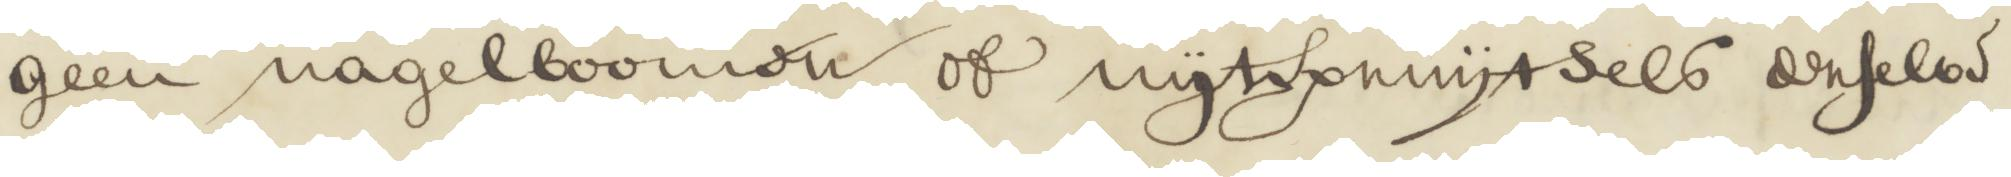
geen nagelboomen of uijtspruijtsels derselve
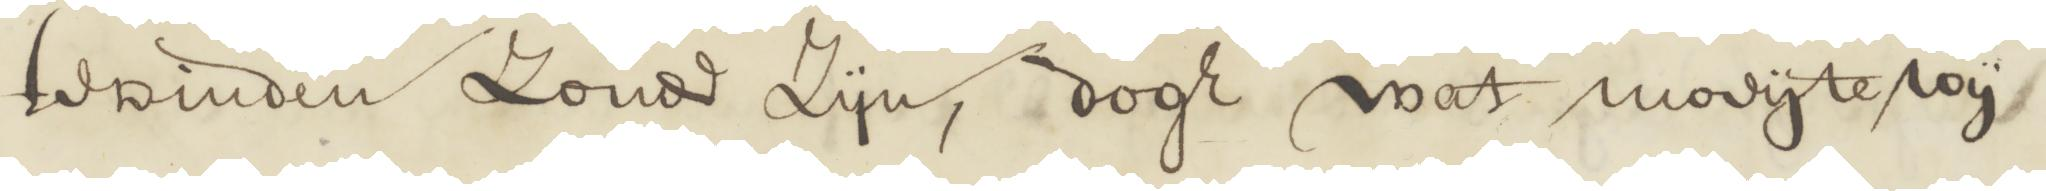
te vinden Zoude Zijn, dogh wat moeijte wij
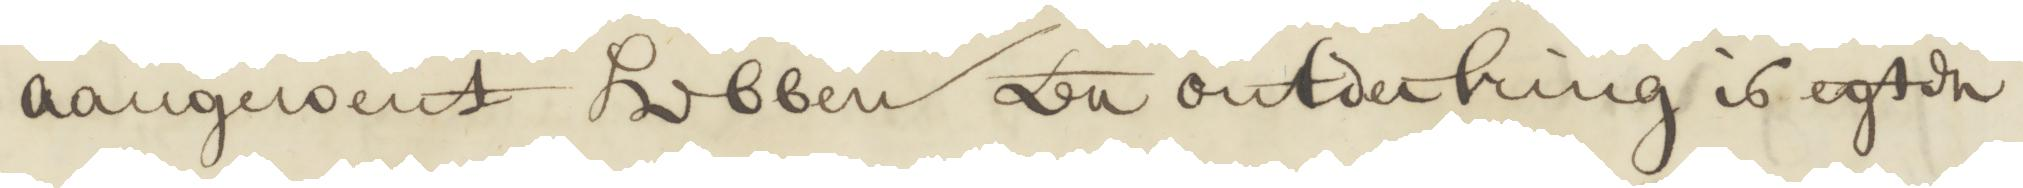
aangewent hebben ter ontdecking is egter
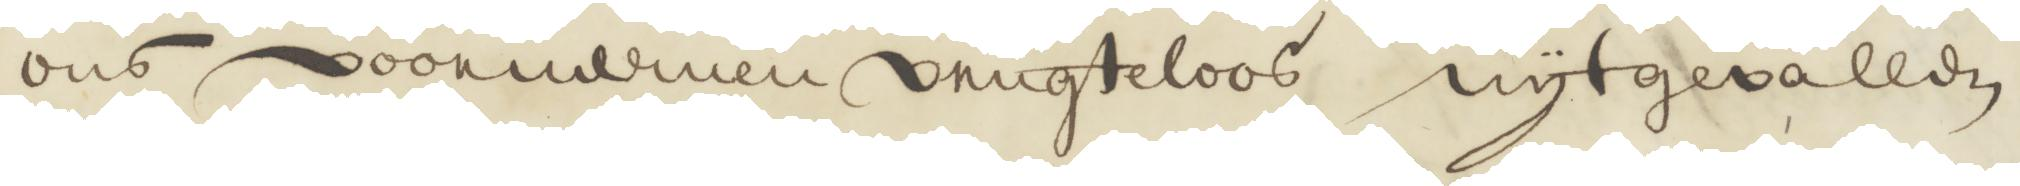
ons voorneemen vrugteloos uijtgevallen
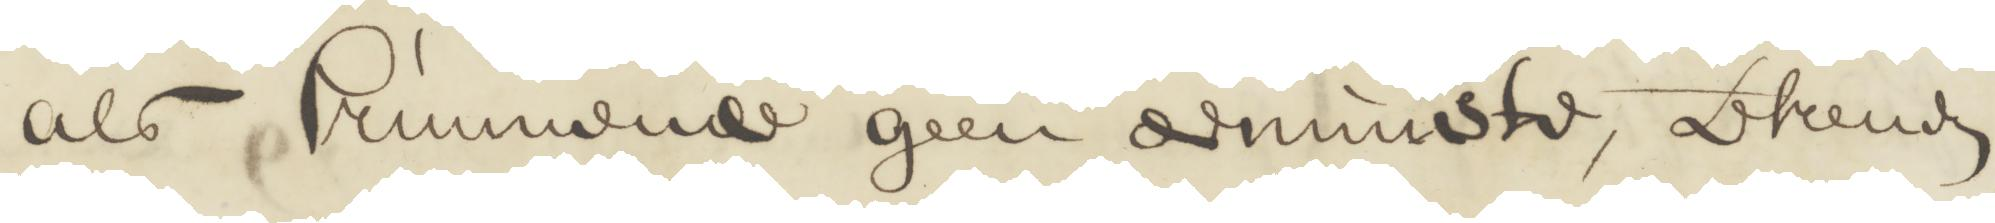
als kunnende geen deminste, tekenen
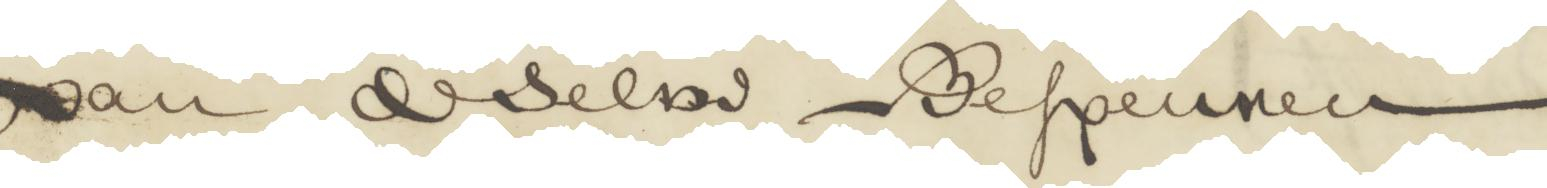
van deselve Bespeuren
